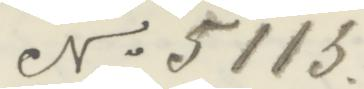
N.o 5113.
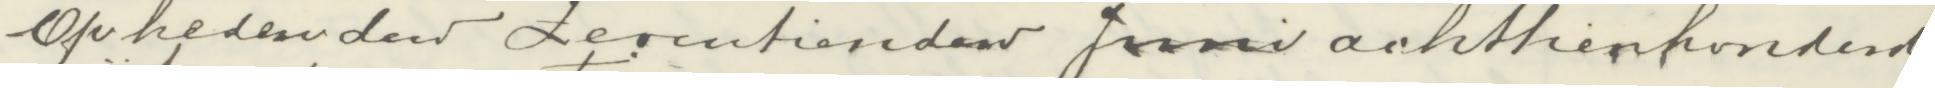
Op heden den Zeventienden Juni achttienhonderd
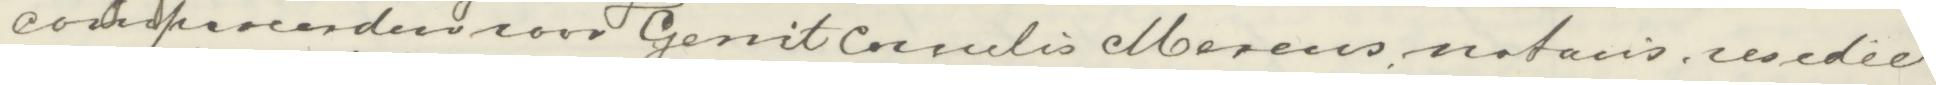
compareerden voor Gerrit Cornelis Merens, notaris, residee
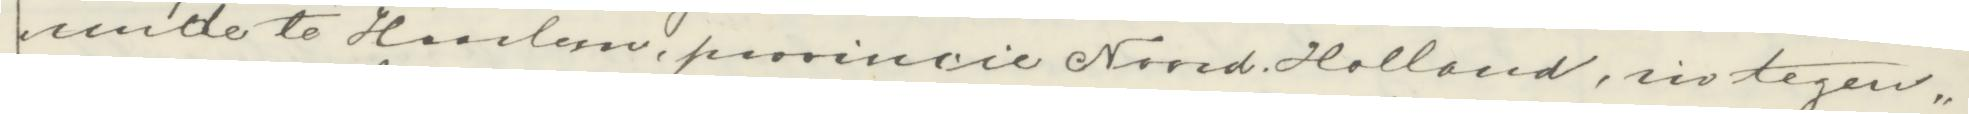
rende te Haarlem, provincie Noord.Holland, in tegen„
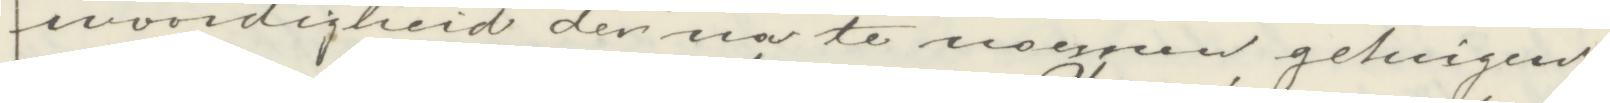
woordigheid der na te noemen getuigen
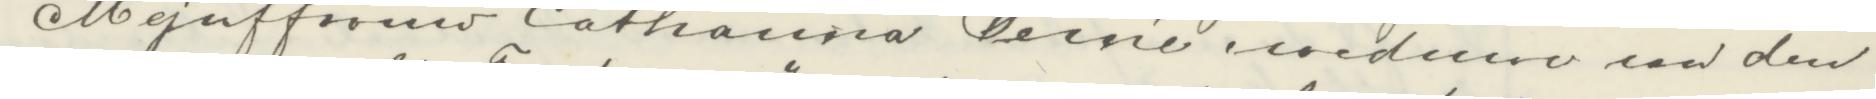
Mejuffrouw Catharina Serné weduwe van den
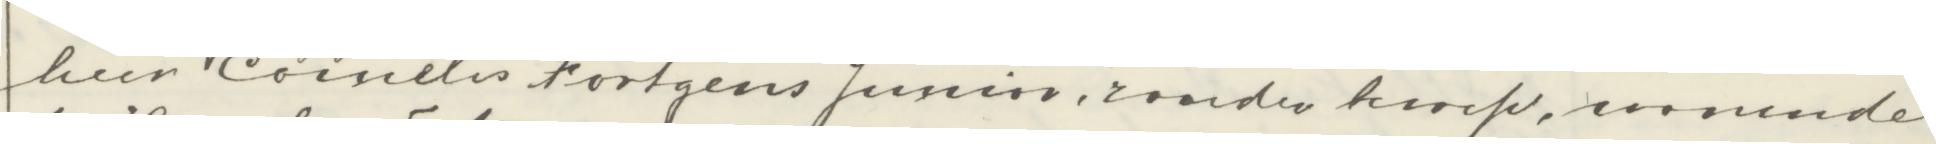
heer Cornelis Fortgens Junior, zonder beroep, wonende
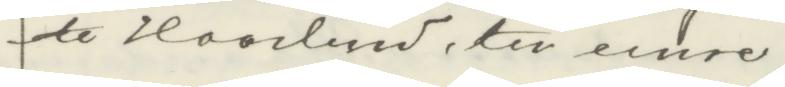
te Haarlem, ter eenre
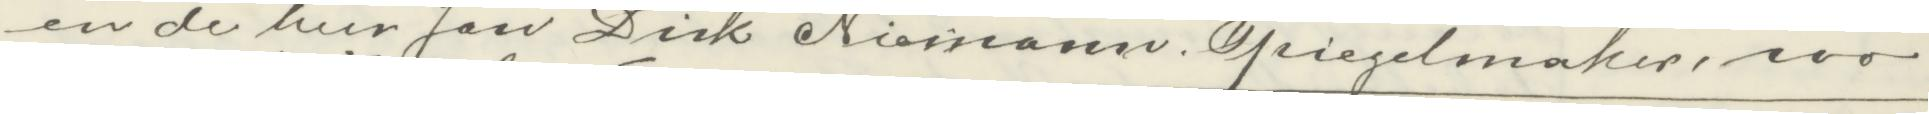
en de heer Jan Dirk Niemann, Spiegelmaker, woo
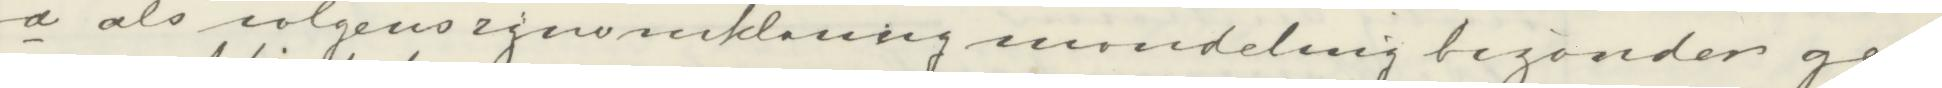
a als volgens zijn verklaring mondeling bezonder ge.
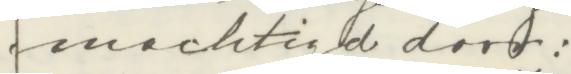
machtigd door.
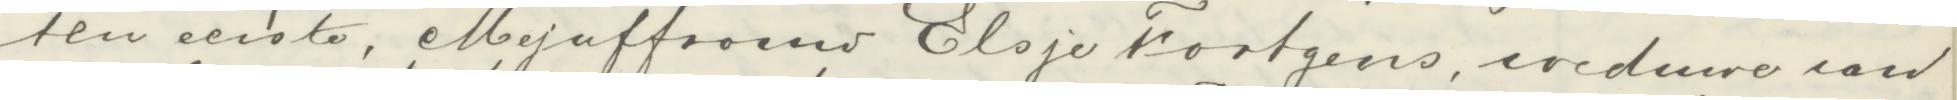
ten eerste, Mejuffrouw Elsje Fortgens, weduwe van
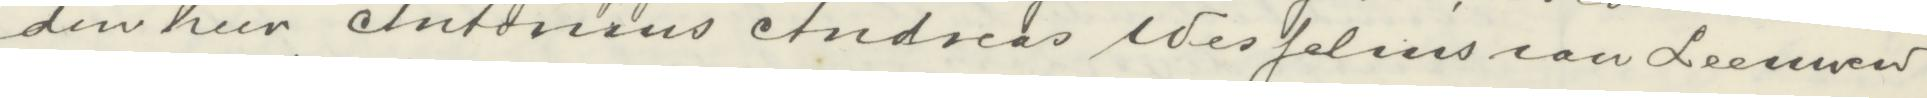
den heer Anthonius Andreas Wesselius van Leeuwen
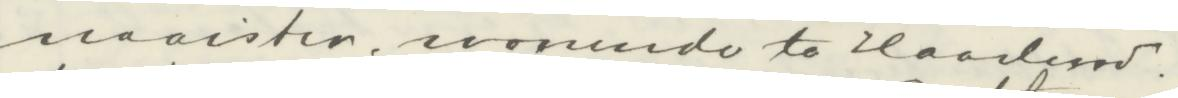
naaister, wonende te Haarlem.
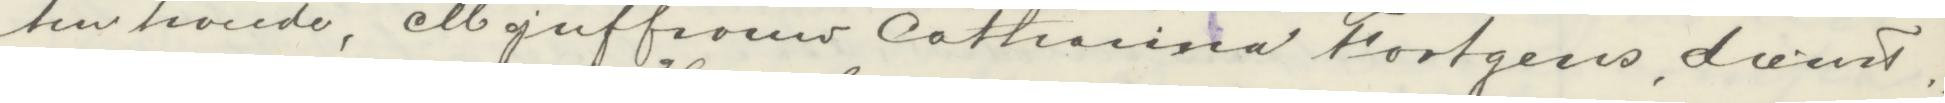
ten tweede, Mejuffrouw Catharina Fortgens, dienst,
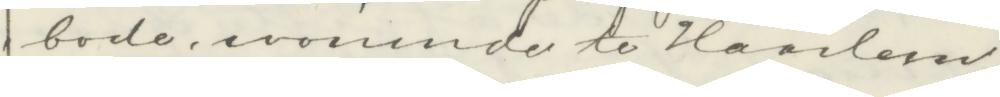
bode, wonende te Haarlem
